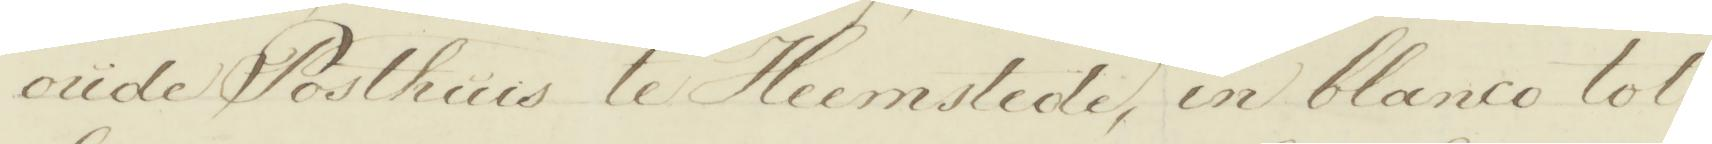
oude Posthuis te Heemstede, in blanco tot
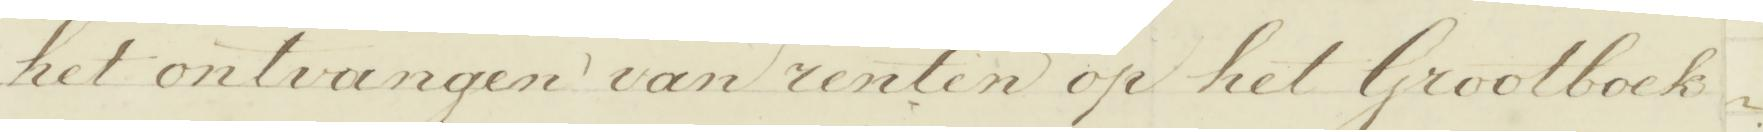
het ontvangen van renten op het Grootboek
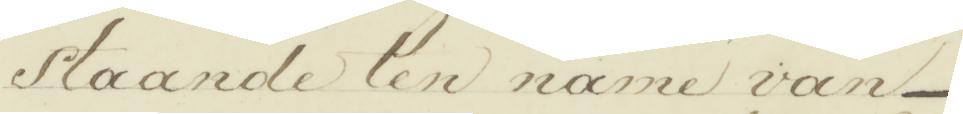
staande ten name van
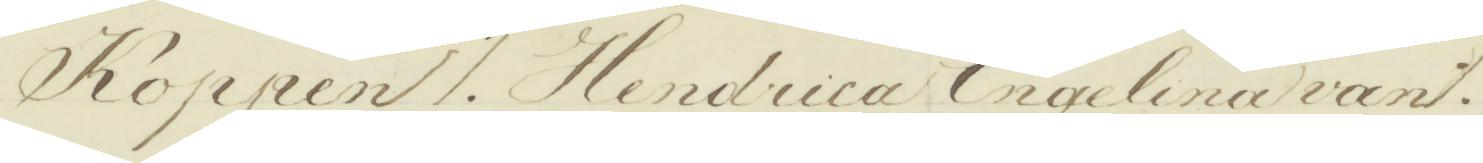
Koppen ./. Hendrica Engelina van ./.
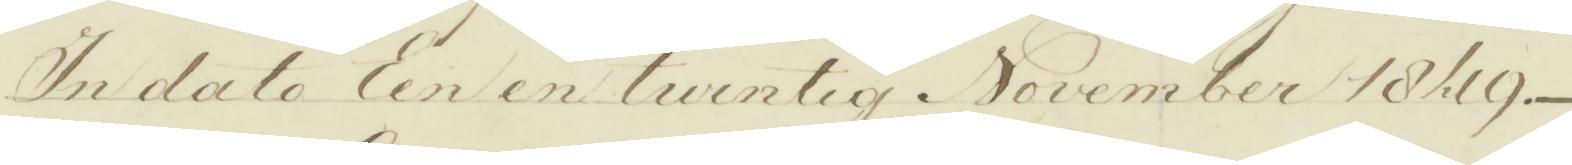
In dato Een en twintig November 1849.
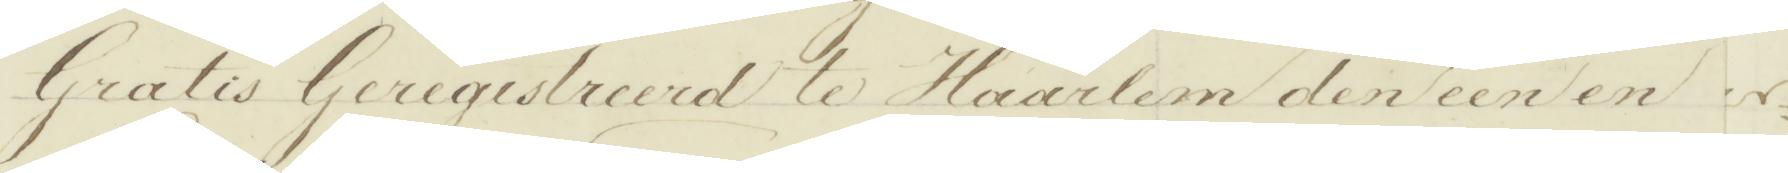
Gratis Geregistreerd te Haarlem den een en
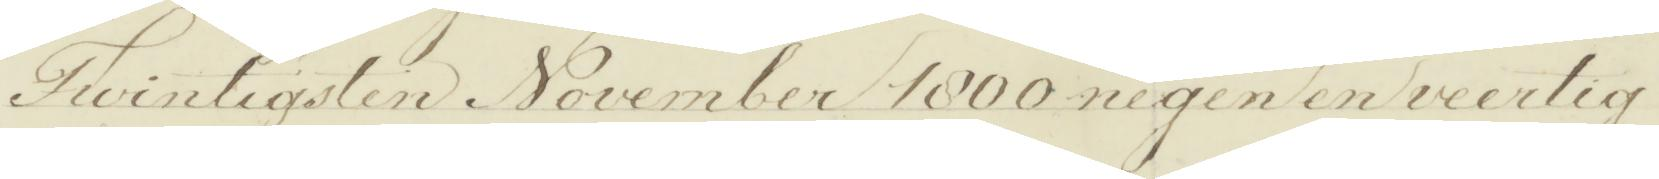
Twintigsten November 1800 negen en veertig
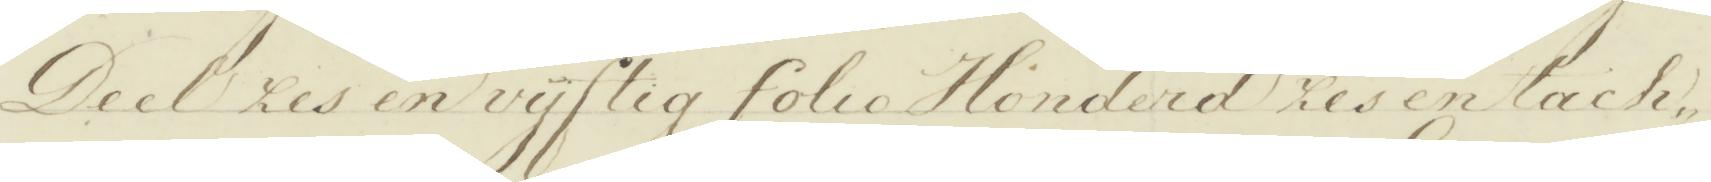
Deel zes en vijftig folio Honderd zes en tach„
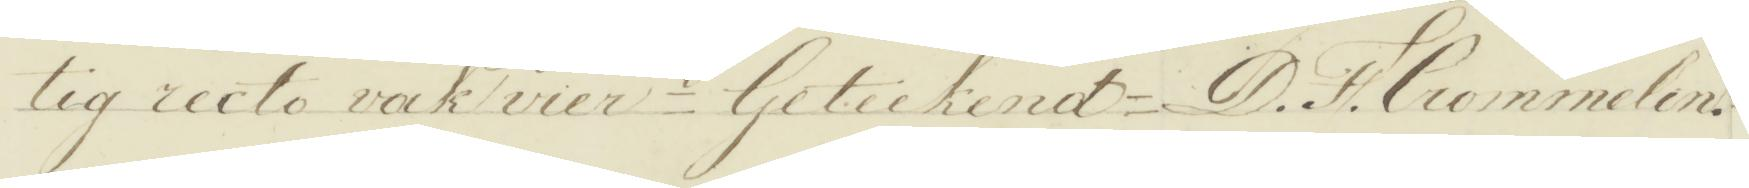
tig recto vak vier =Geteekend= D.F. Crommelin.
